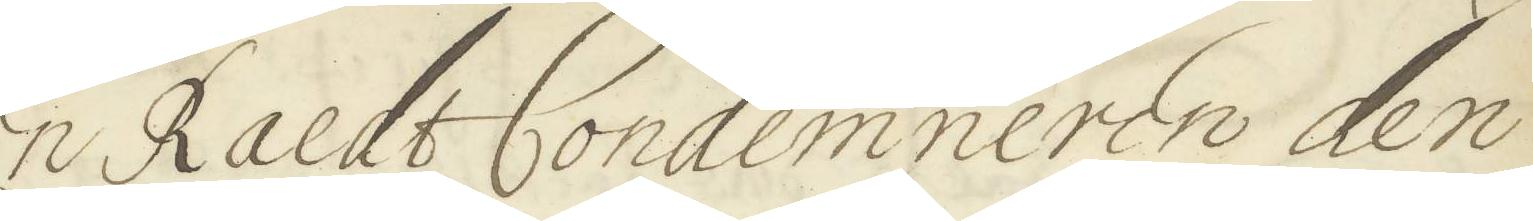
Den Raedt Condemneren den
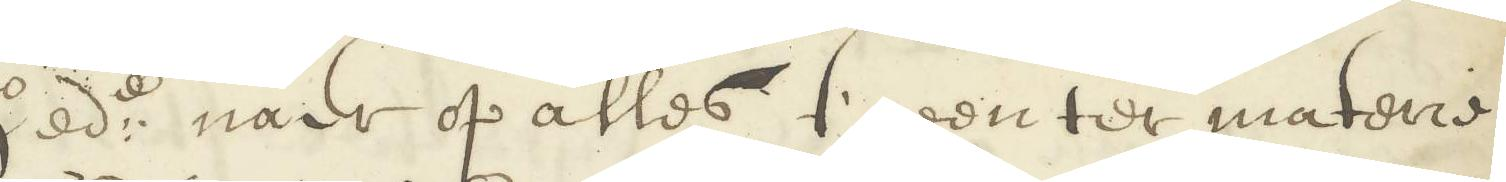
Ged:e naer op alles t' geen ter materie
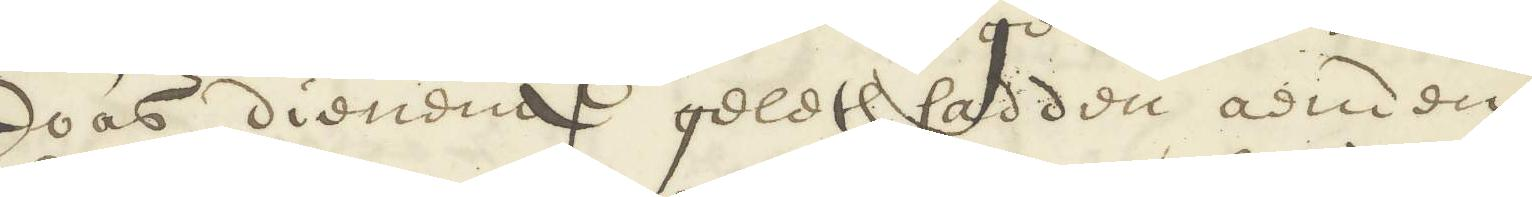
was dienende geleth hadden aenden
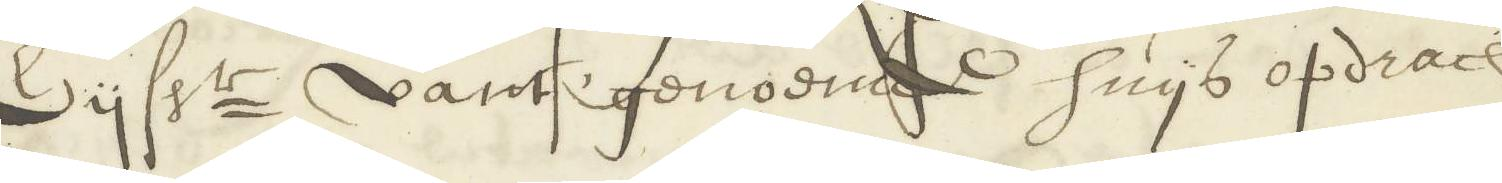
Eijss=r vant' genoemde huijs opdracht
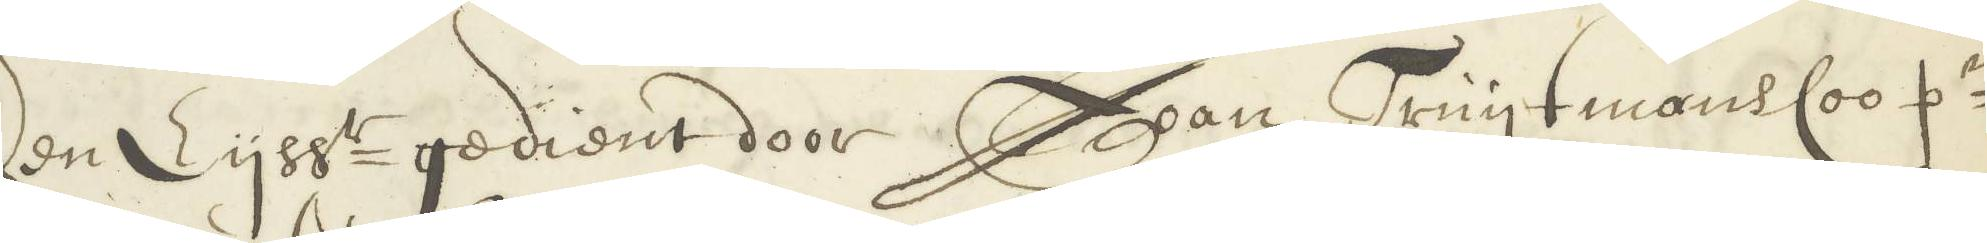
Den Eijss=r gedient door Joan Truijtmans Coop=m
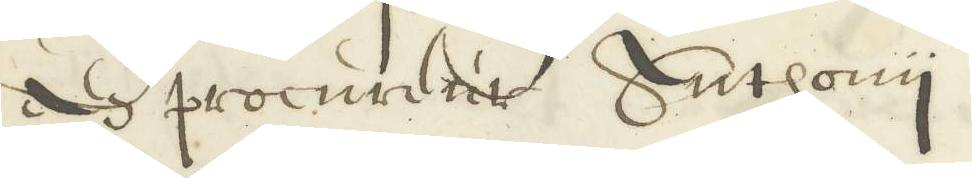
den procureur Anthonij
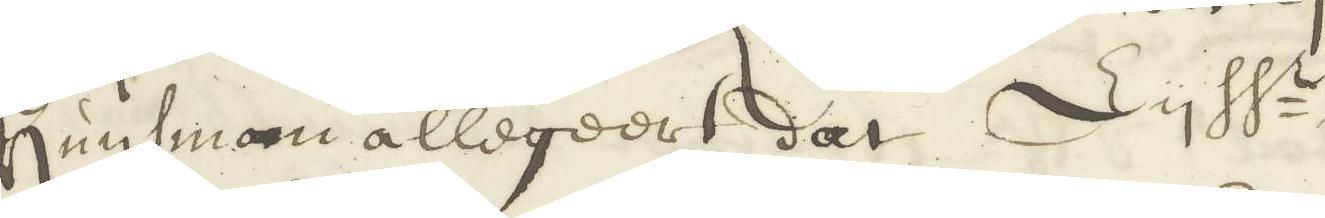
Huysman allegeert dat Eijss=r
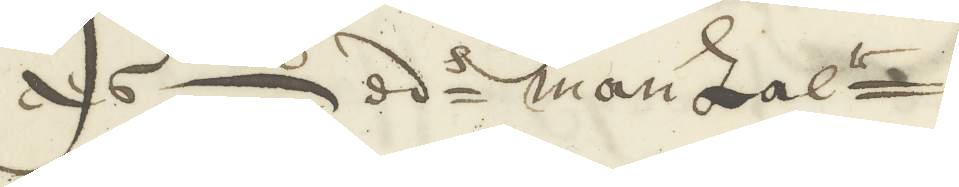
des Ged=s man zal=r
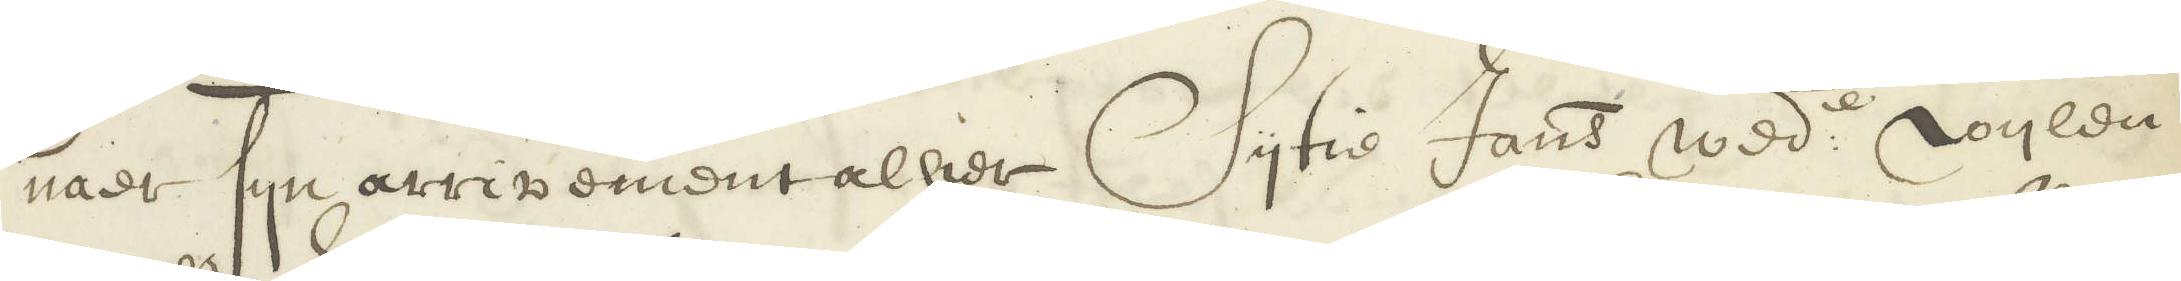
naer syn arrivement alhier Sijtie Jans wed:e wylen
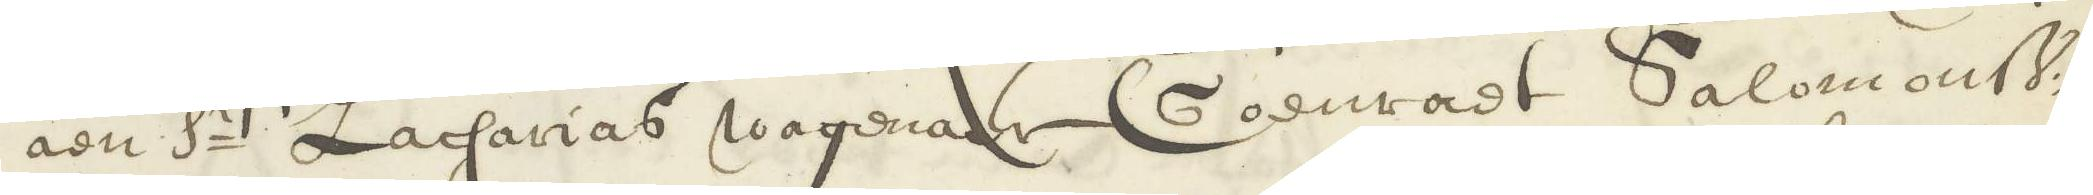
aen s=r Zacharias wagenaer Coenraet Salomonss:
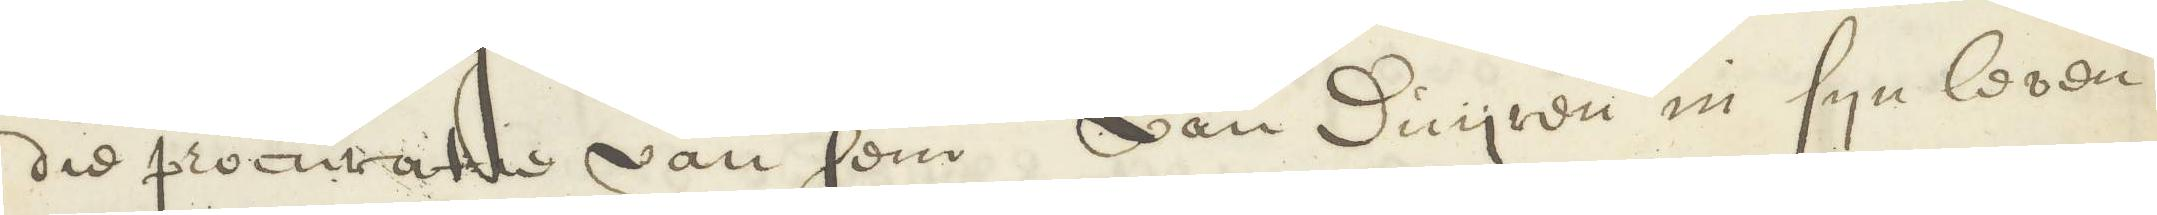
die procuratie van hem van Duijren in syn leven
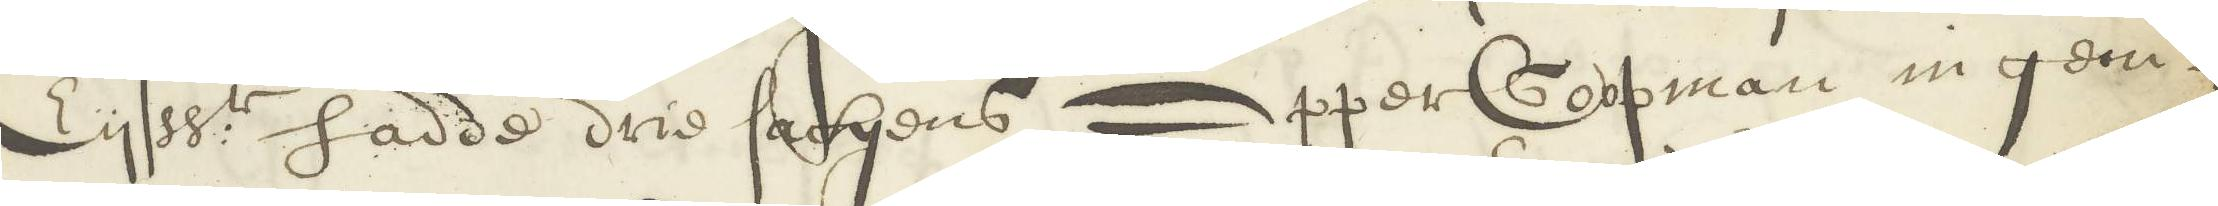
Eijss:r hadde drie sacgens Opper Coopman in gem=e
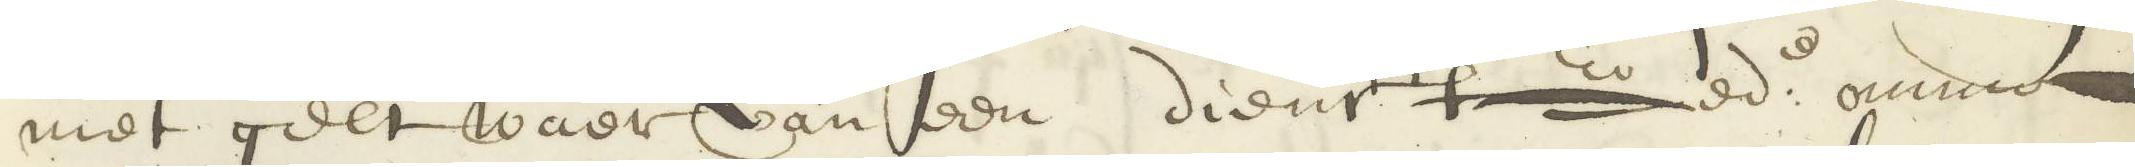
met gelt waer van een dienst Ged:e omme
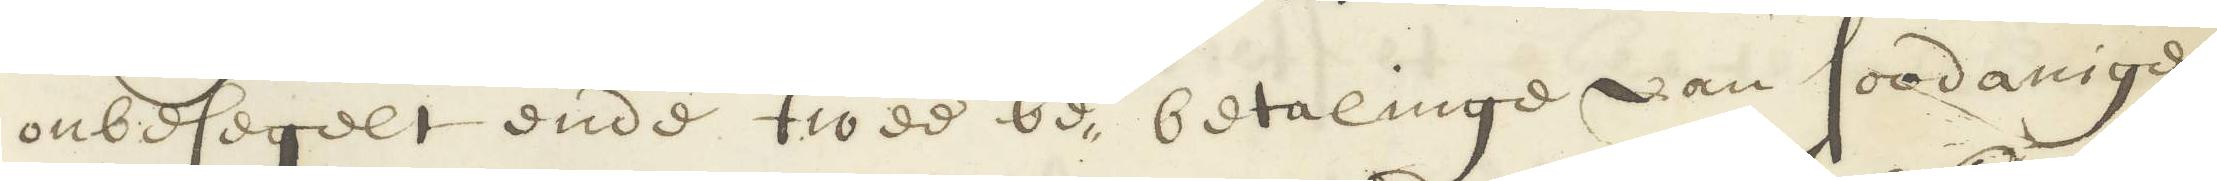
onbesegelt ende twee be„ betalinge van soodanige
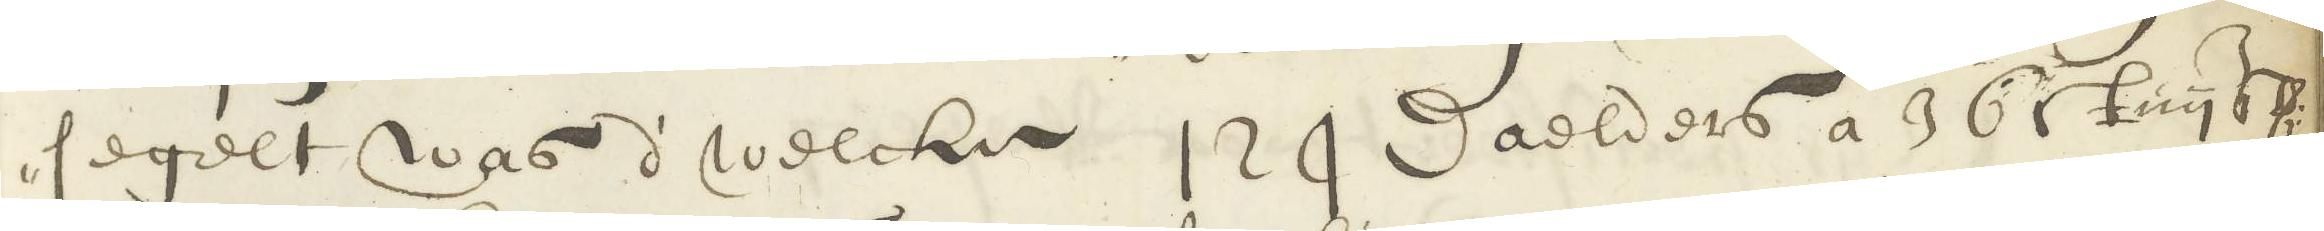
„segelt was d’ welcke 124 Daelders a 36 stuijvers
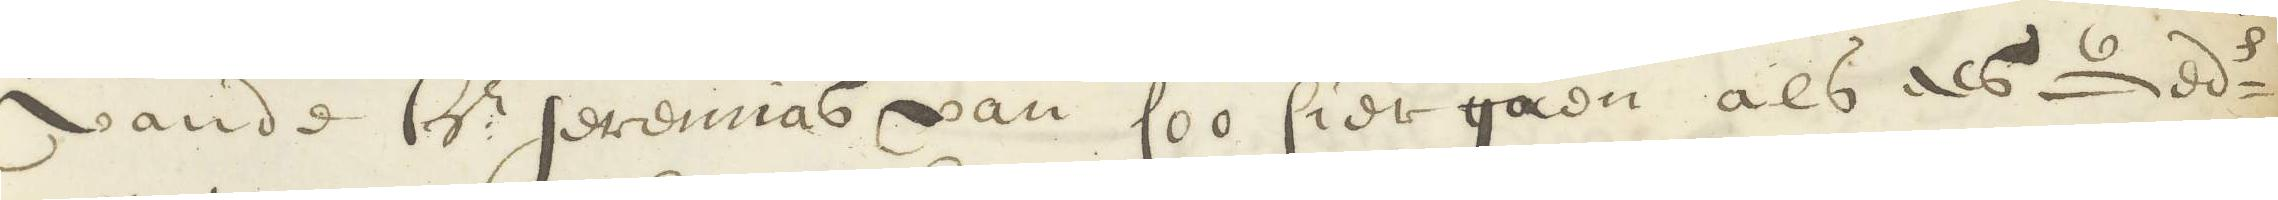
vande H:r jeremias van soo sier gaen als des Ged=s
